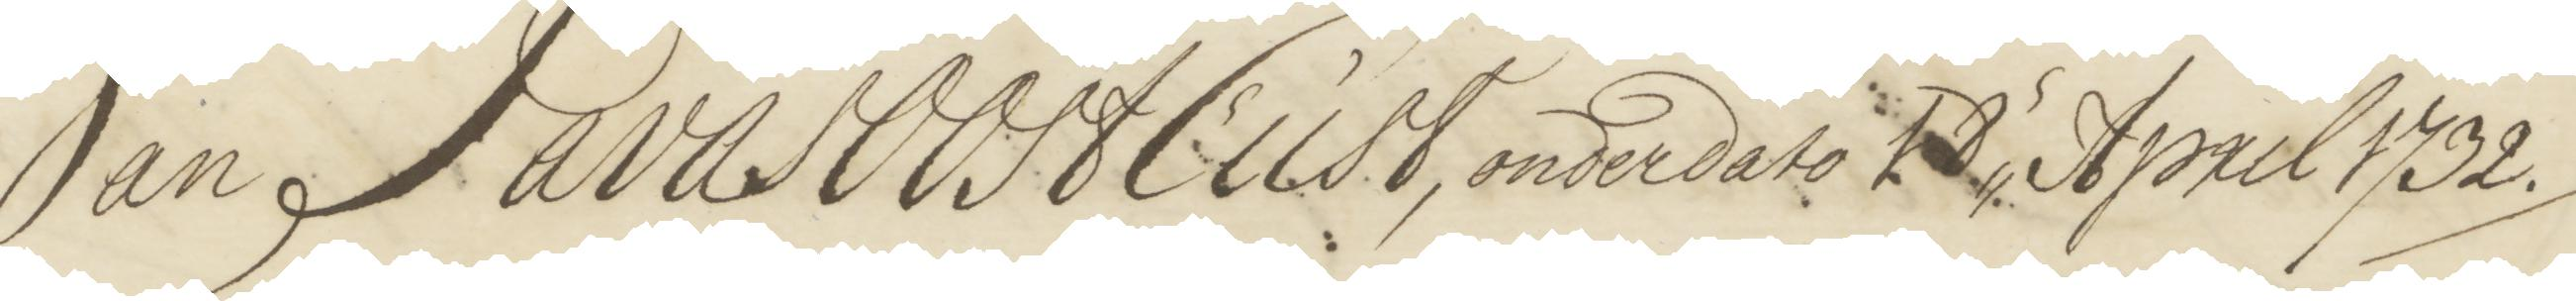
Van Iavas OostCust, onder dato 18:' April 1732.
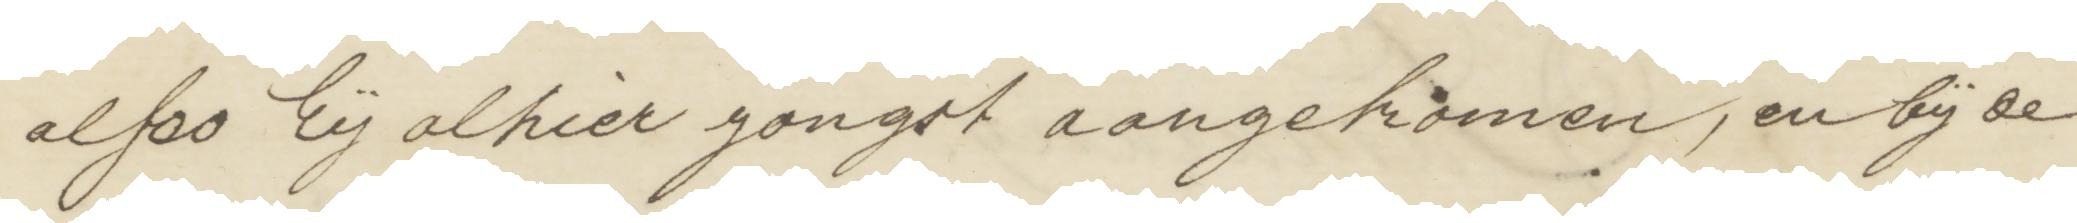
alsoo hij alhier jongst aangekomen, en bij de
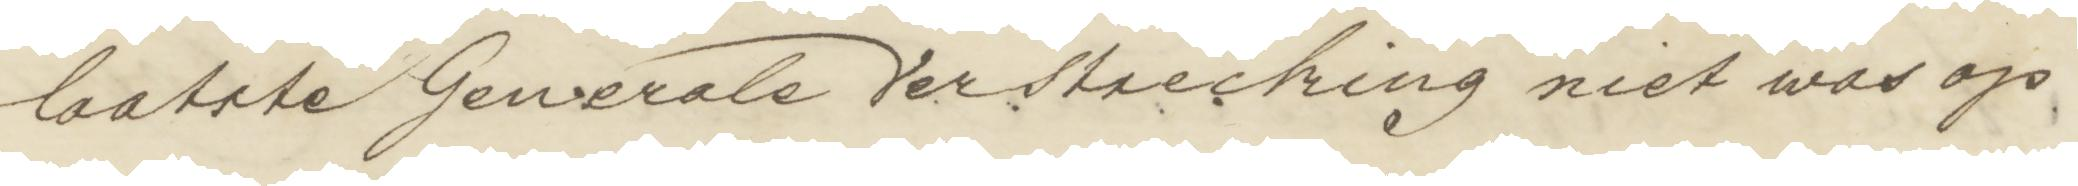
laatste Generale Verstrecking niet was op
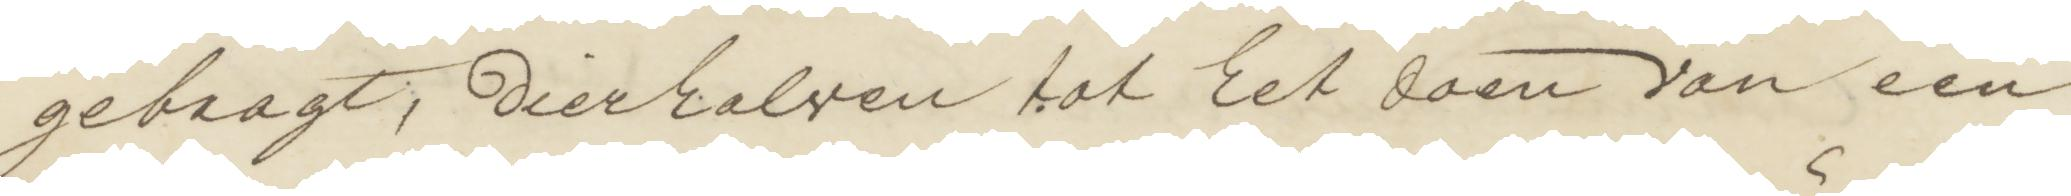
gebragt, dierhalven tot het doen van een
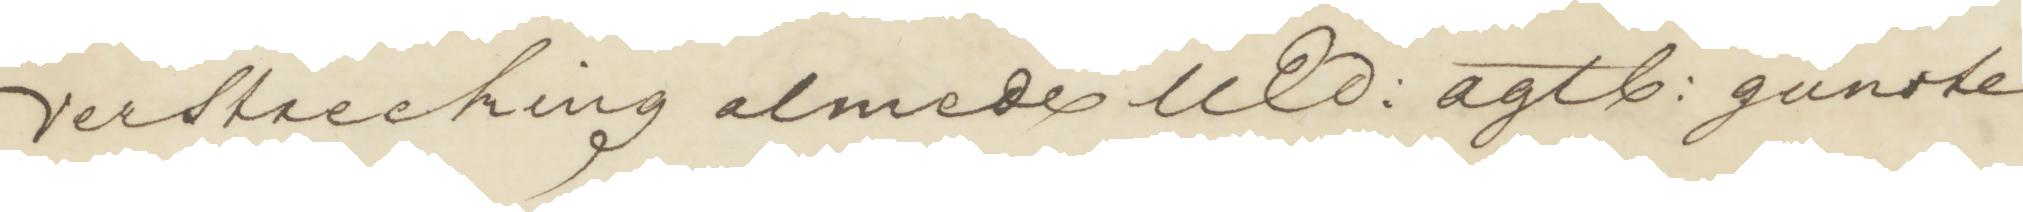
Verstrecking almede uEd: agtb: gunste
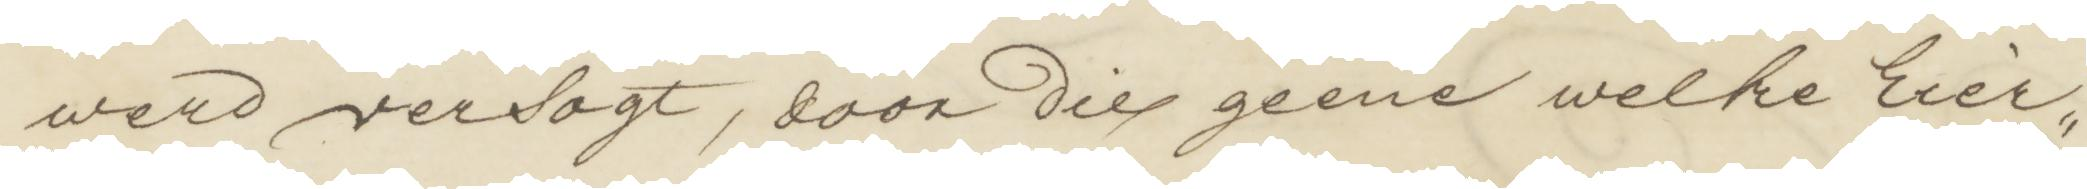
werd versogt, door die geene welke hier„
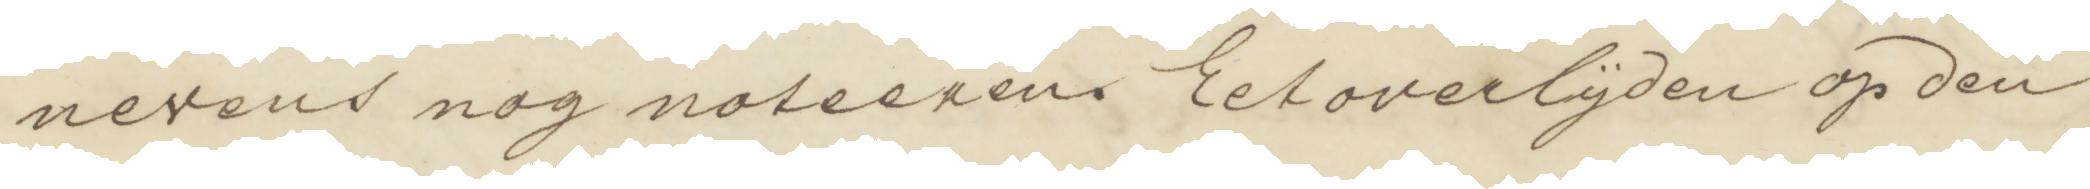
nevens nog noteeren. het overlijden op den
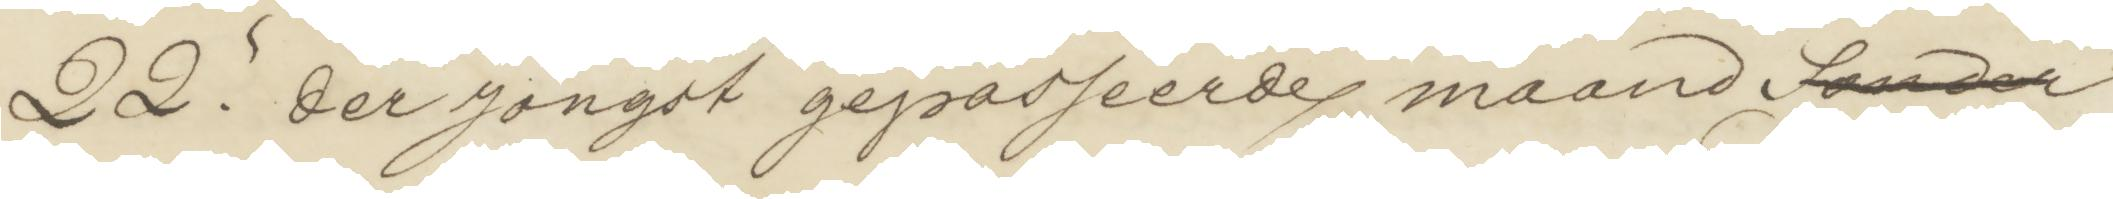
22.' der jongst gepasseerde maand sonder
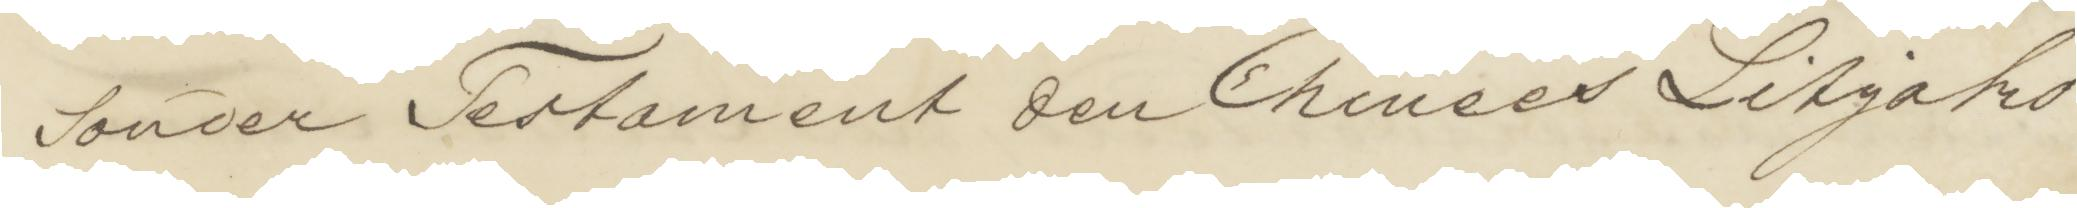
sonder Testament den Chinees Litijako
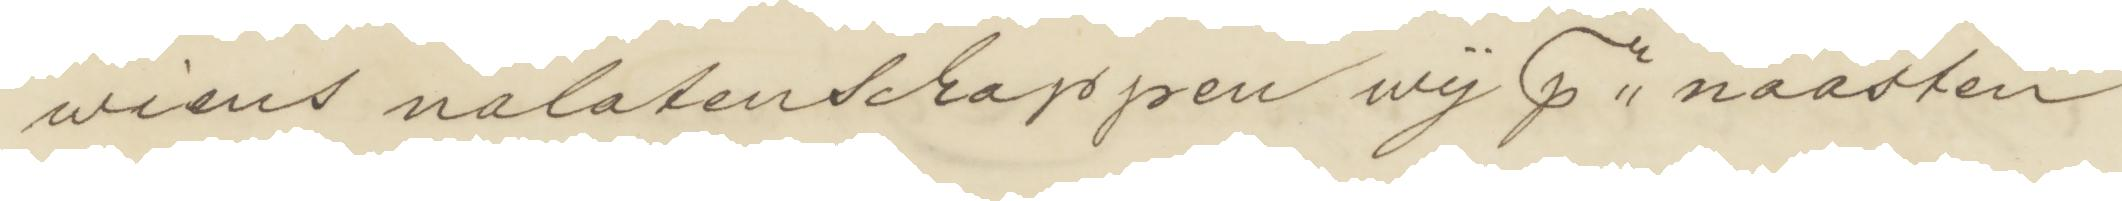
wiens nalatenschappen wij p„r naasten
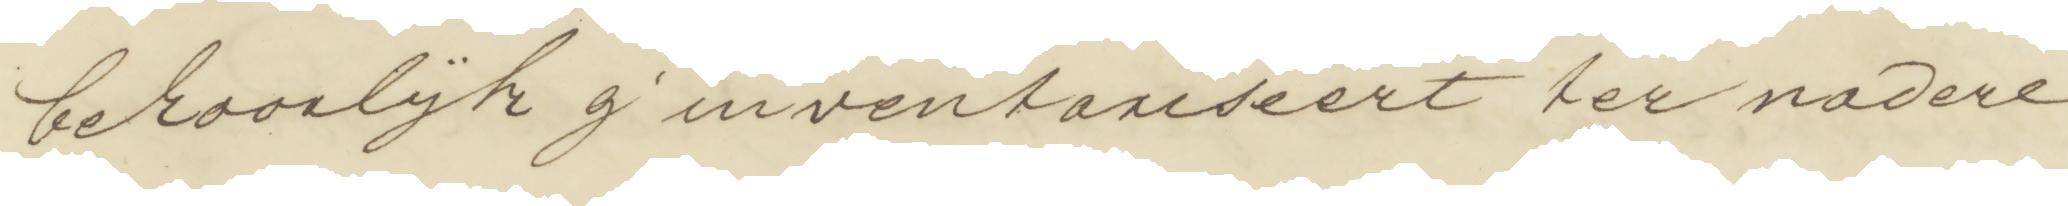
behoorlijk g’ inventariseert ter nadere
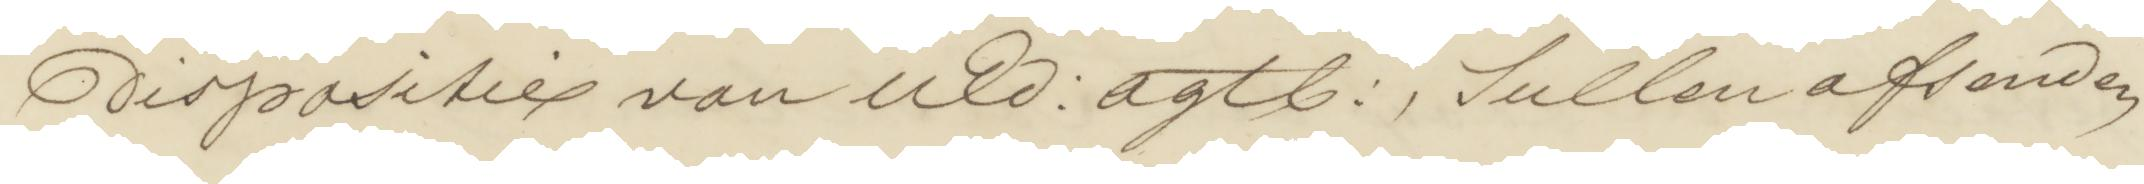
dispositie van uEd: agtb:, sullen afsenden
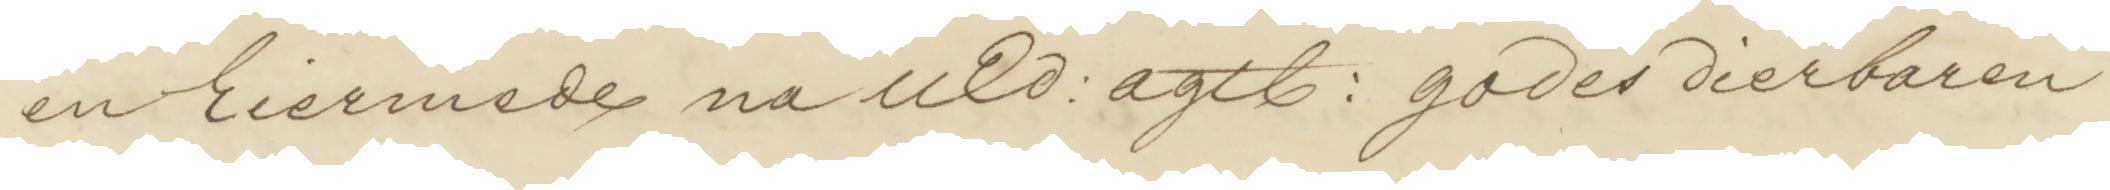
en hiermede na uEd: agtb: godes dierbaren
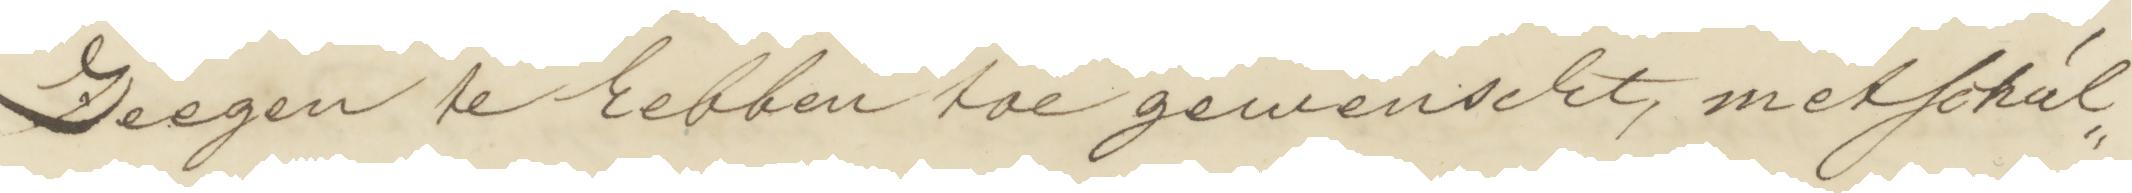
Zeegen te hebben toe gewenscht, met schul„
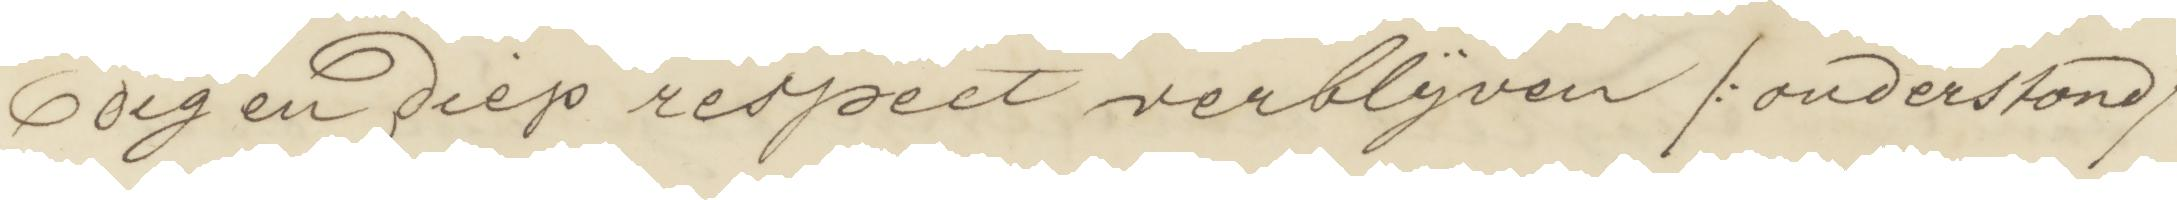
dig en diep respect verblijven /:onderstond/
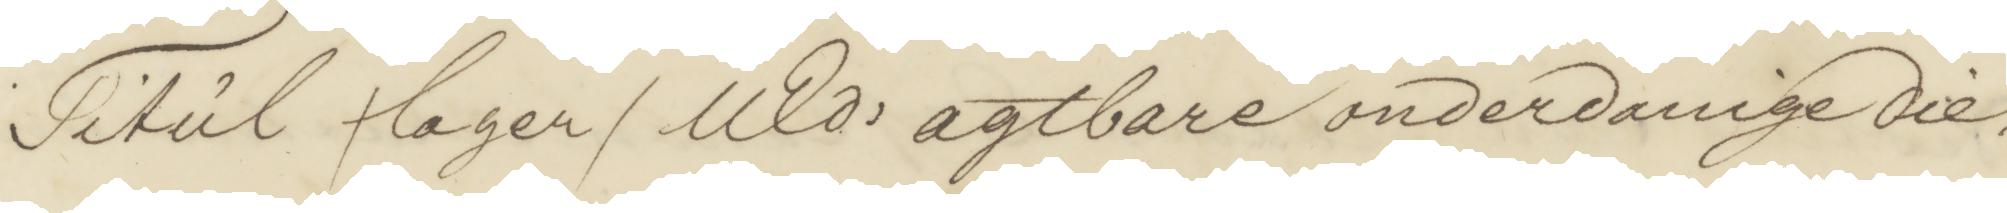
Titul /lager/ UEd: agtbare onderdanige die„
